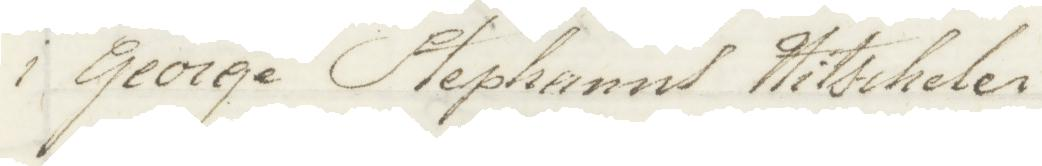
1 George Stephanus Witscheler
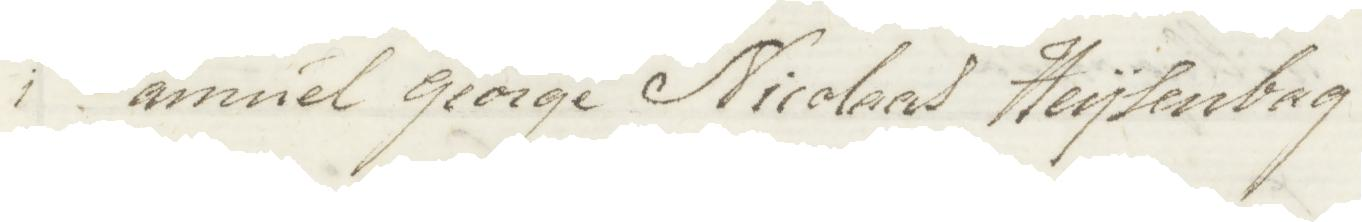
1 Samuel George Nicolaas Heijsenbag
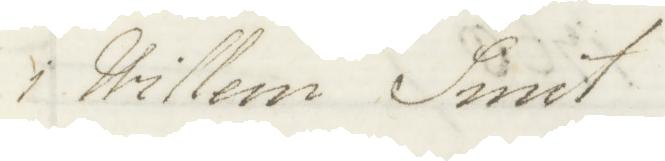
1 Willem Smit
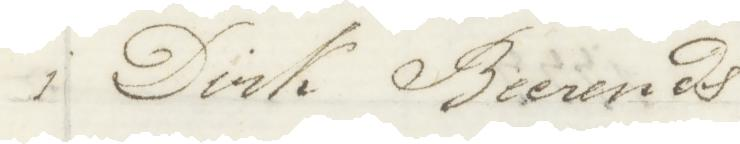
1 Dirk Bierends
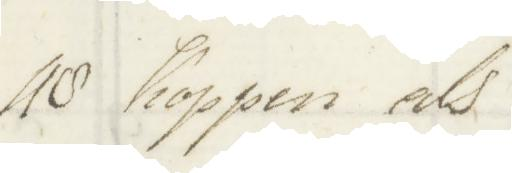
48 koppen als
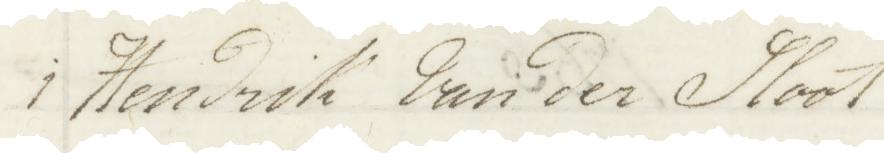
1 Hendrik van der Sloot
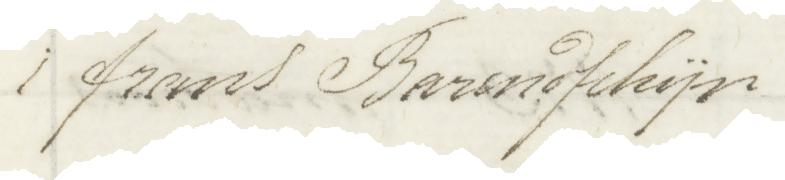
1 frans Barendschijn
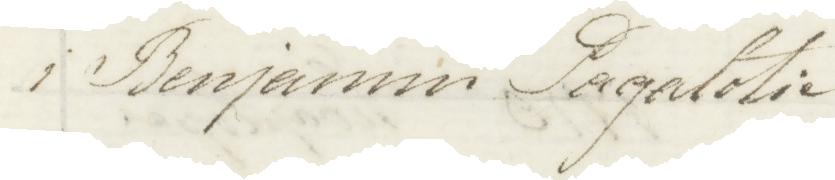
1 Benjamin Pagalotie
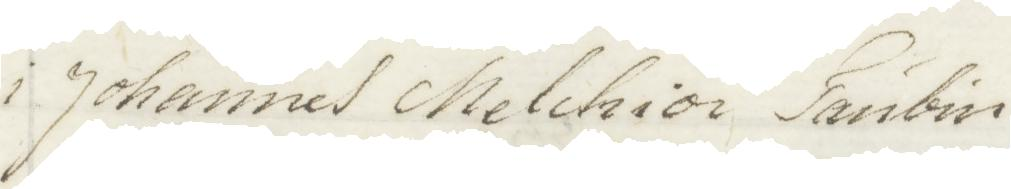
1 Johannes Melchior Taubin
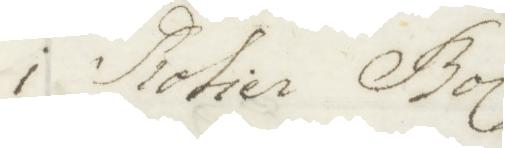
1 Rosier Box
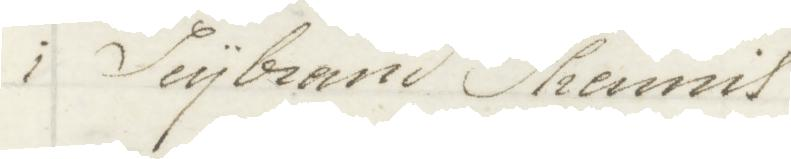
1 Seijbrand Theunis
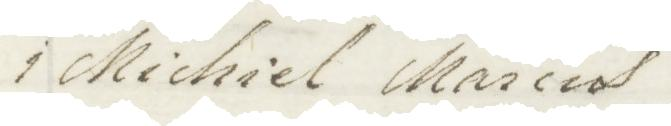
1 Michiel Marcus
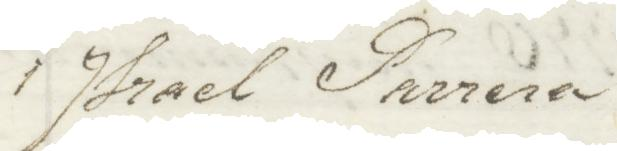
1 Israel Parrera
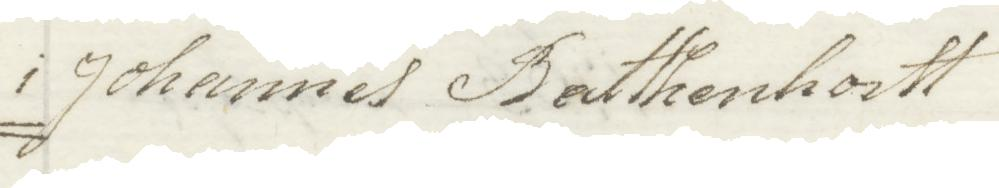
1 Johannes Bathenhorst
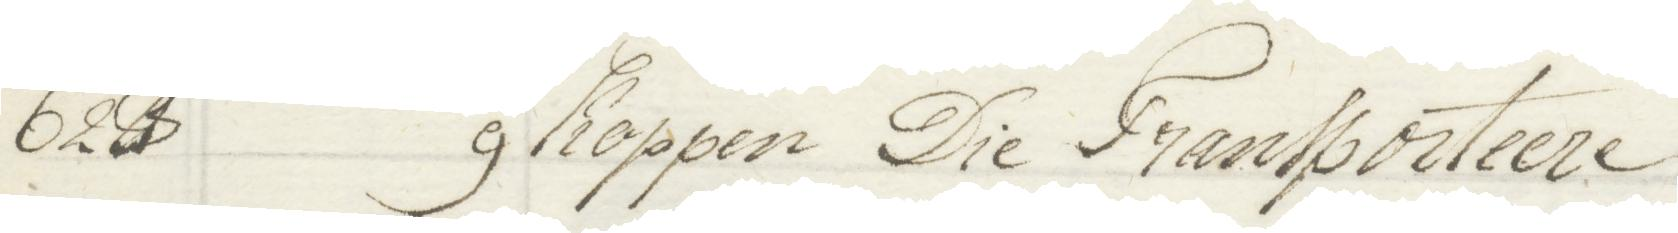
623 9 koppen Die Transporteere
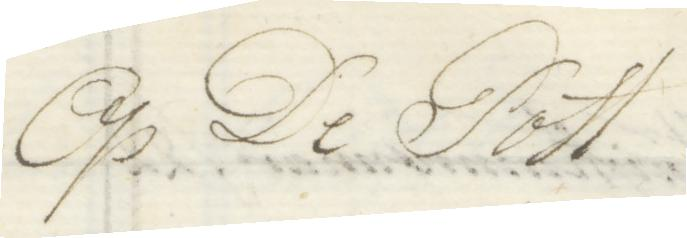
Op De Post
